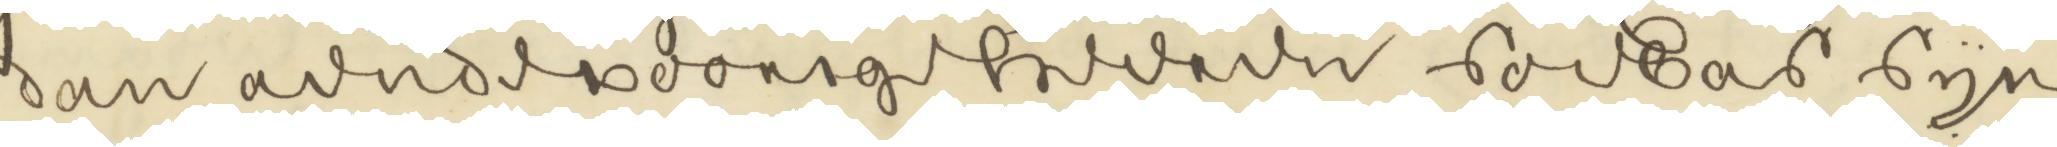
dan aende voorige heeren soebas sijn
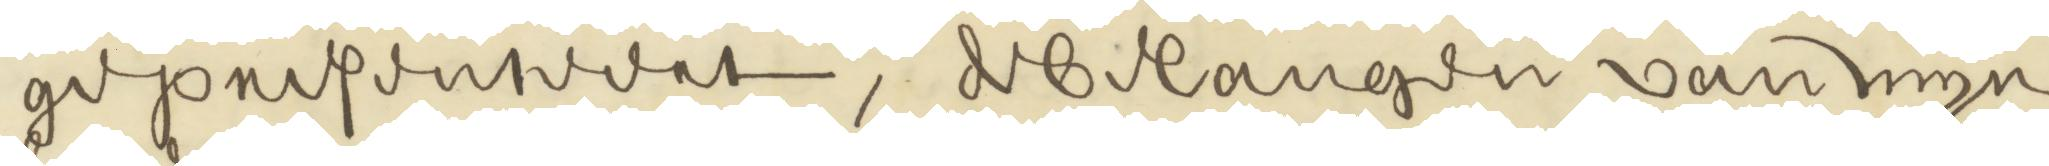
gepresenteert, debelangen van mijn
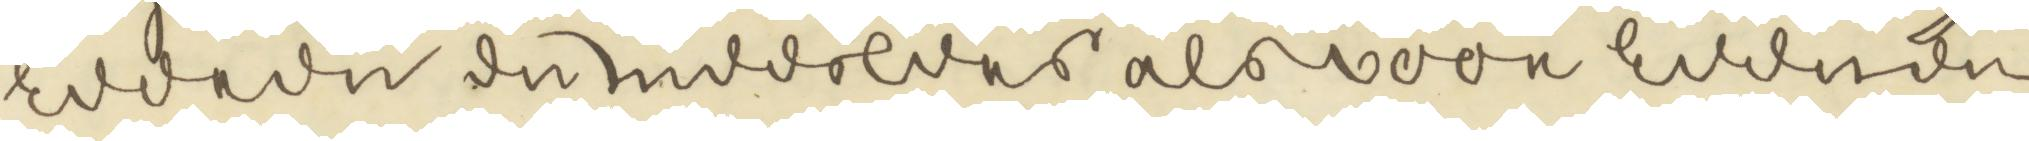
heeren en meesters als voor heenen
